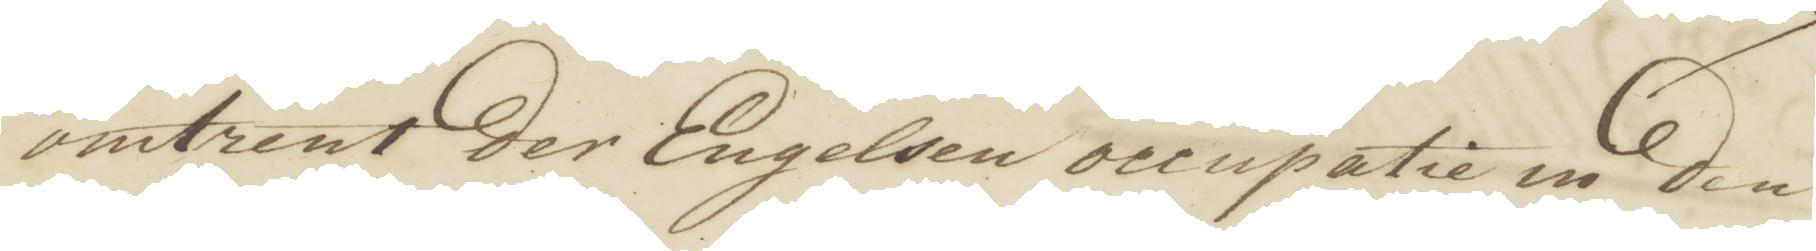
omtrent der Engelsen occupatie in den
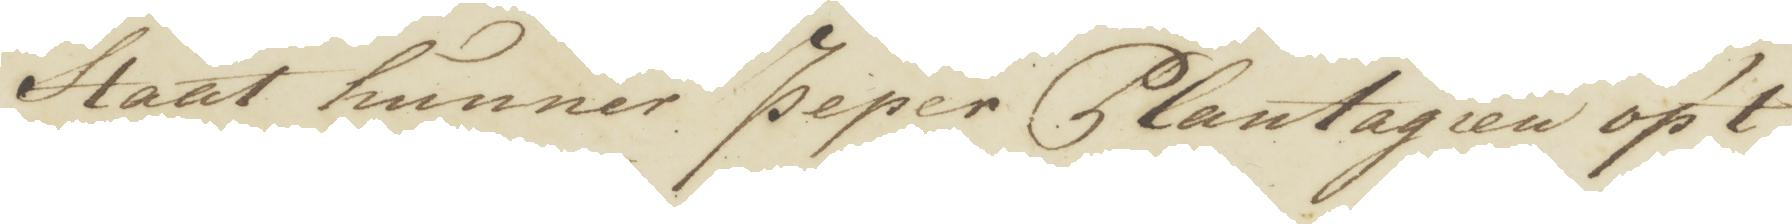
staat hunner peper Plantagien op ’t
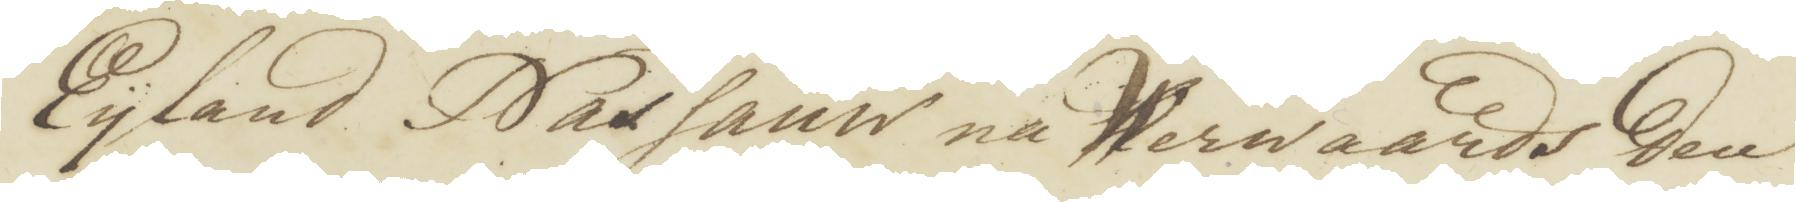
Eijland Nassauw na Werwaards den
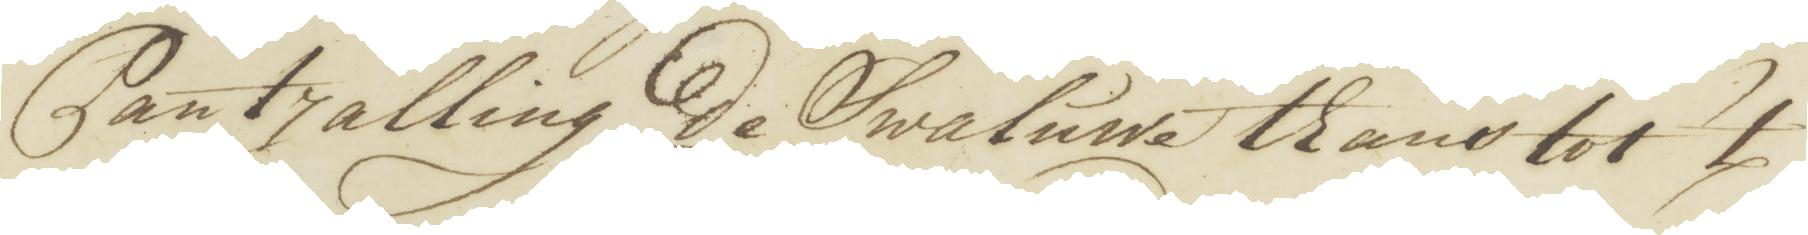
Pantjalling de Swaluwe thans tot ’t
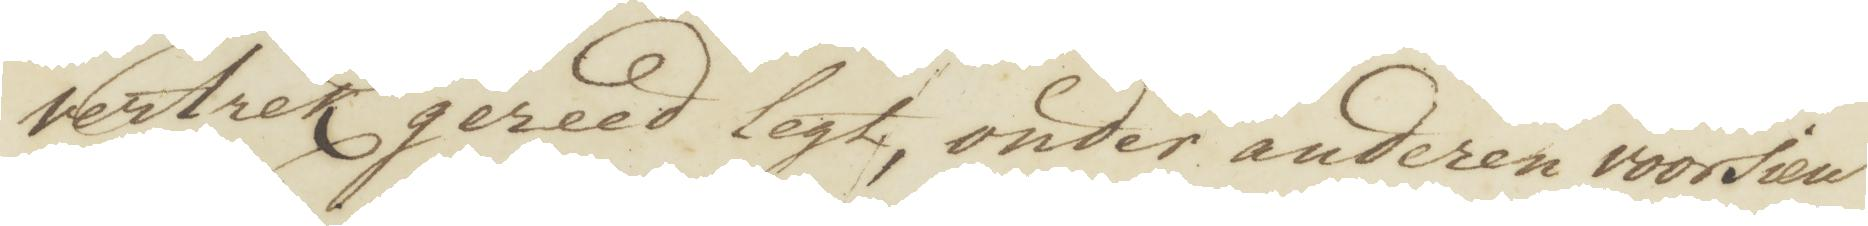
vertrek gereed legt, onder anderen voorsien
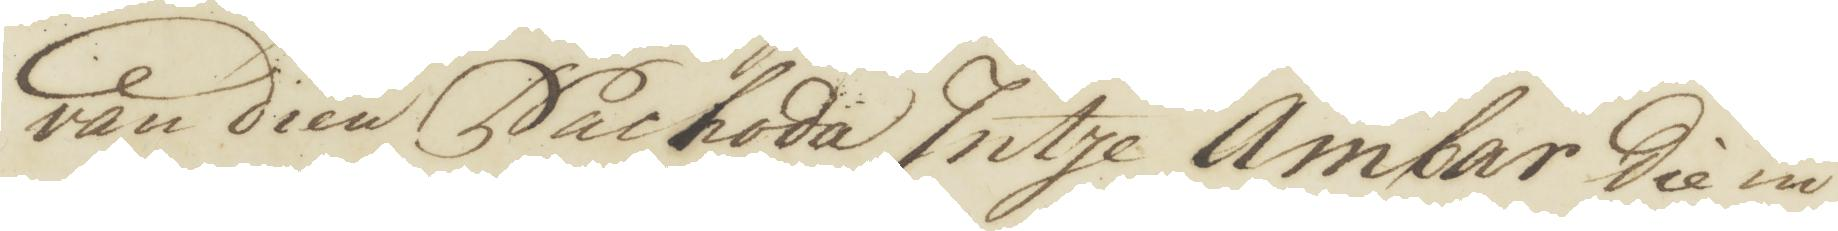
van dien Nachoda Jntje Ambar die in
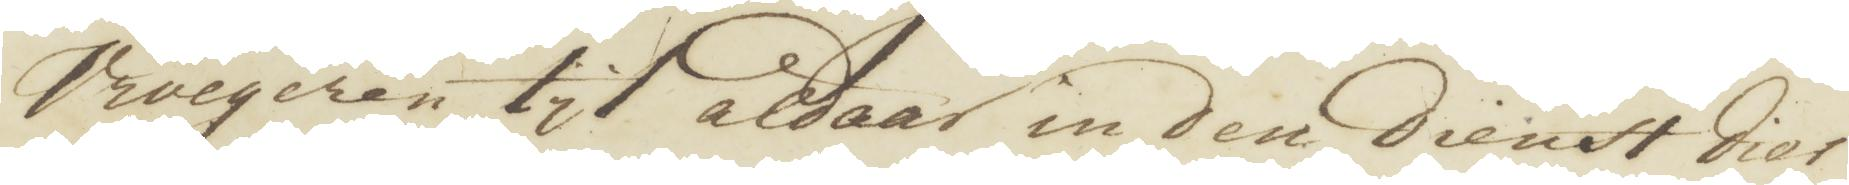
vroegeren tijt aldaar in den dienst dier
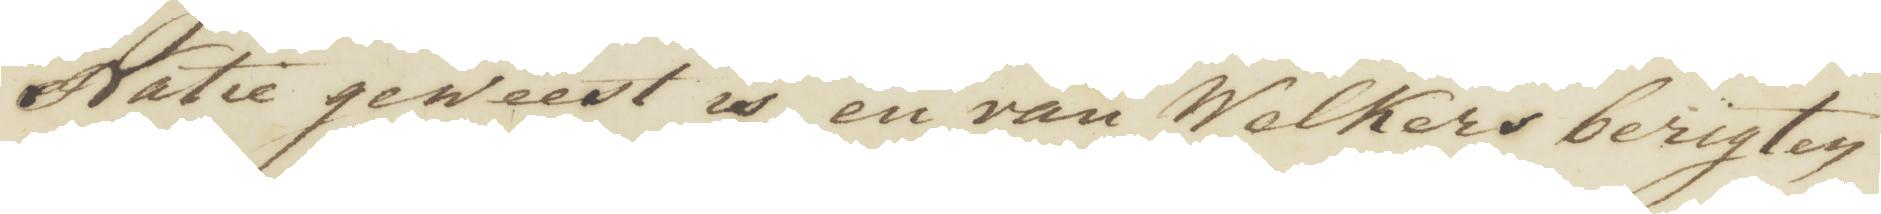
Natie geweest is, en van welkers berigten
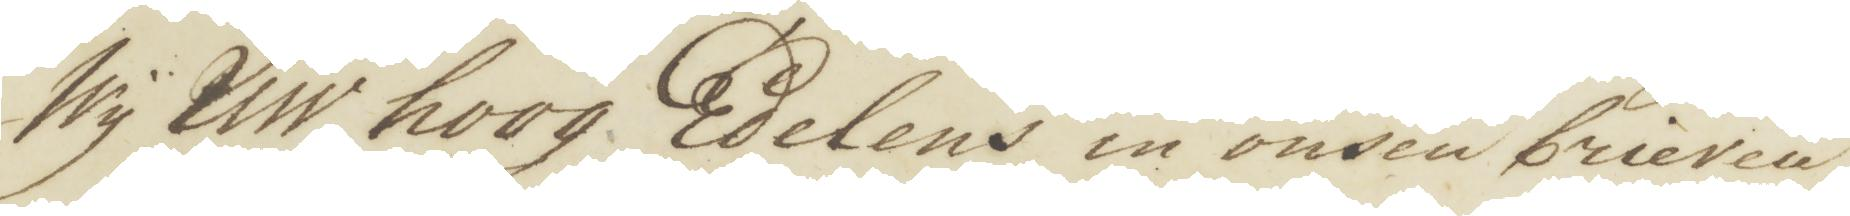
wij uw hoog Edelens in onsen brieven
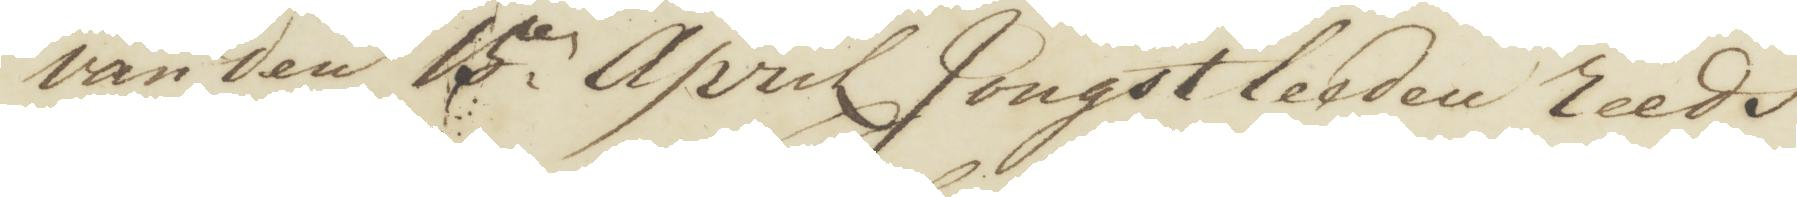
van den 15:en April Jongstleeden reeds
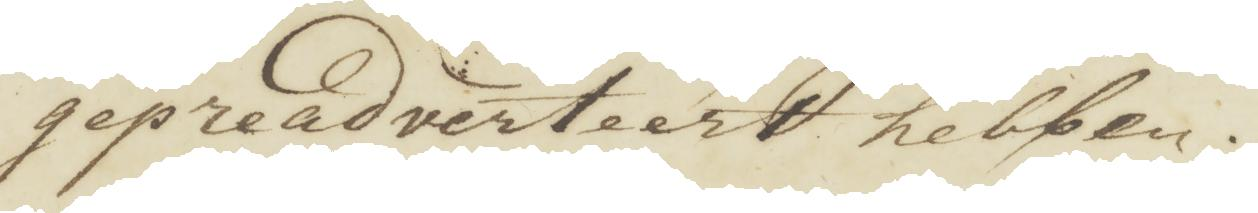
gepreadverteert hebben.
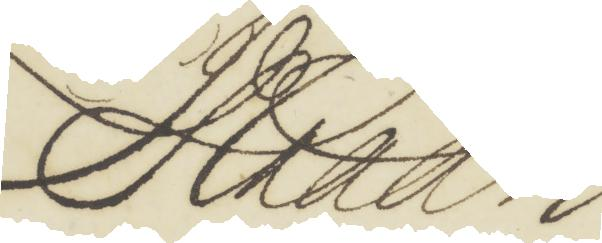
JJ Craan
